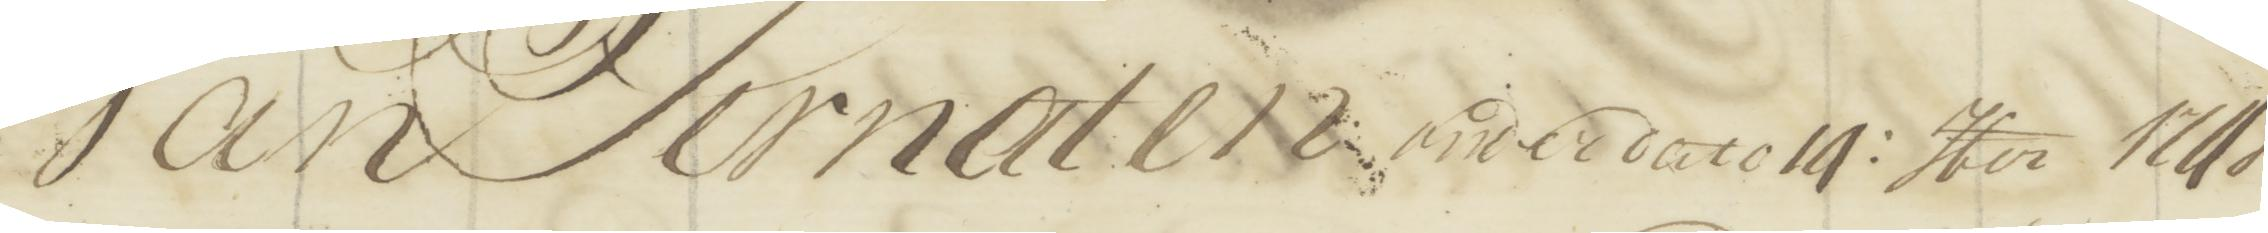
Van Ternaten onder dato 14: 7ber 1741
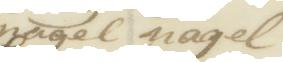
nagel nagel
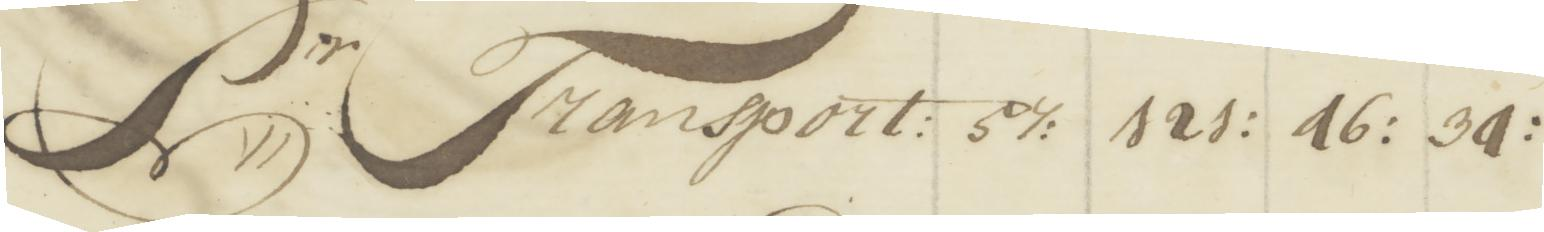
P„r Transport 57: 121: 46: 34
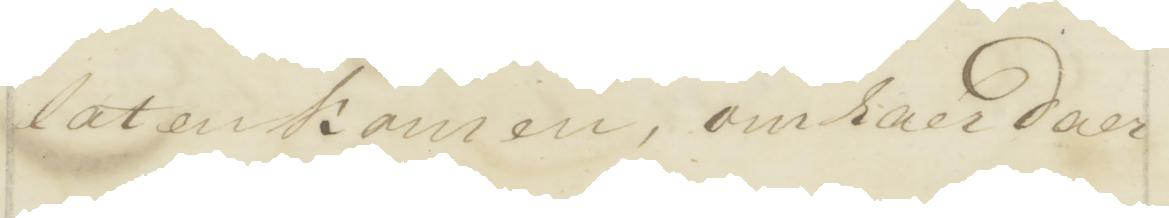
laten komen, om haer daer
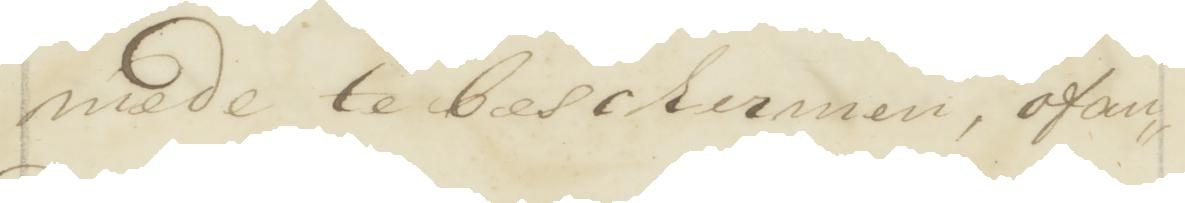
mede te beschermen, of an„
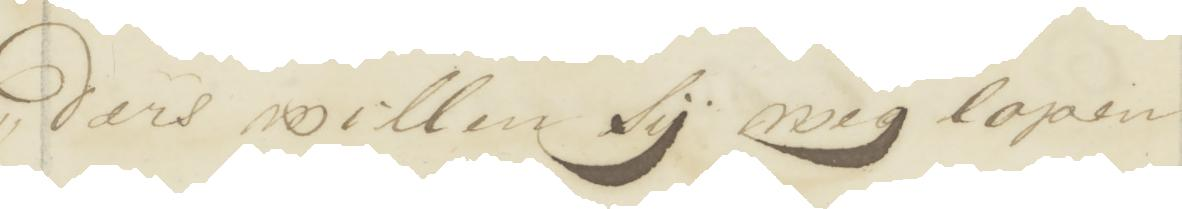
ders willen sij weg lopen
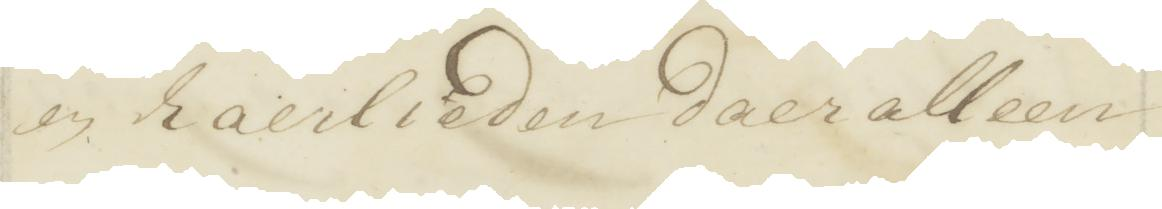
en haerlieden daer alleen
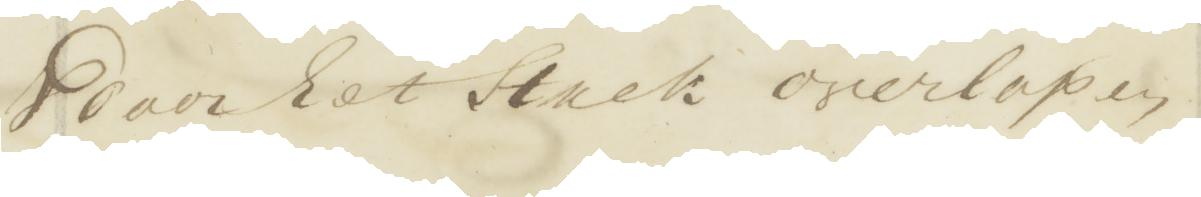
door het strek overlopen
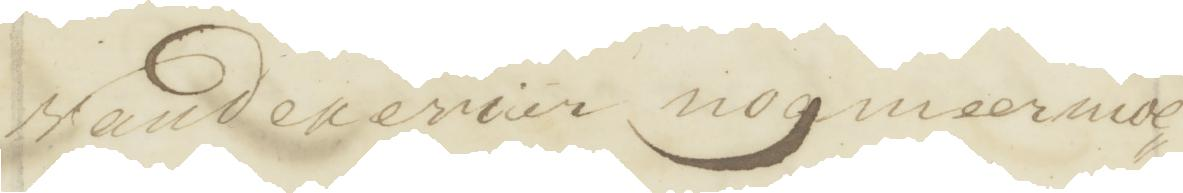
vande revier nog meer moe„
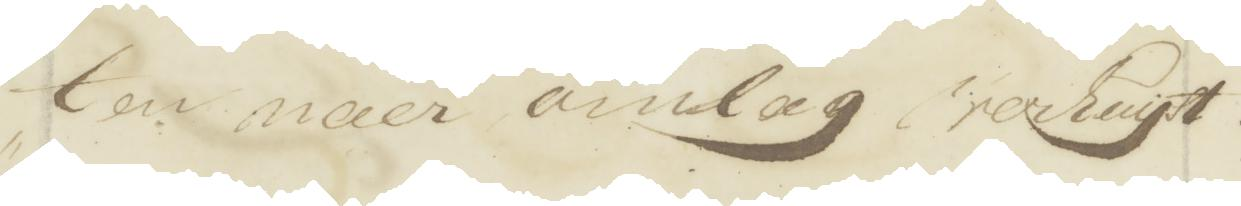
„ten naer omlag verhuijst
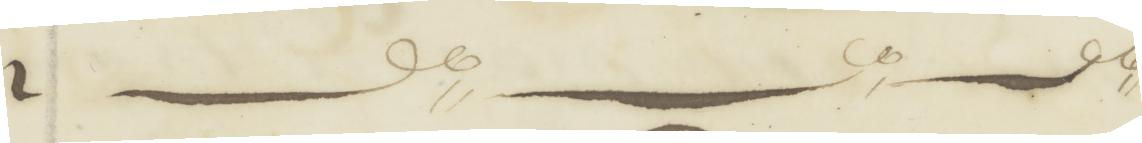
_„o _„o _„o
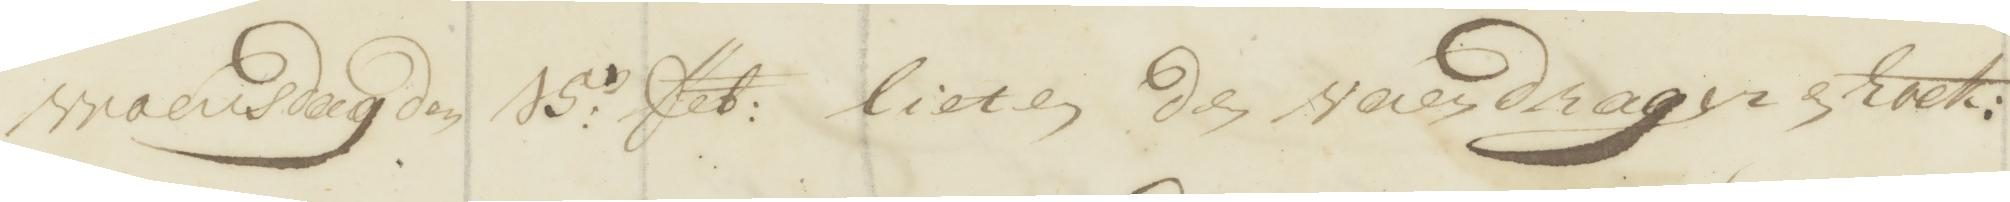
woensdag den 15:n feb: lieten den vaendrager en hoek:
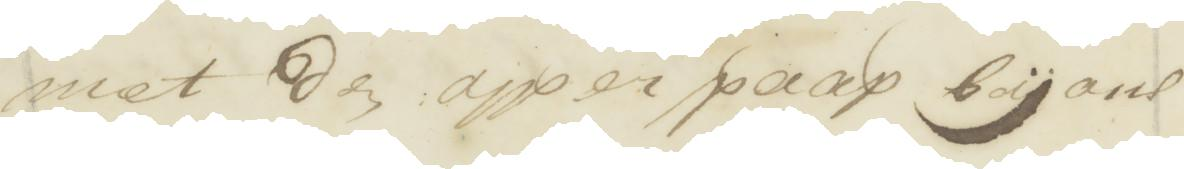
met den opperpaap bij ons
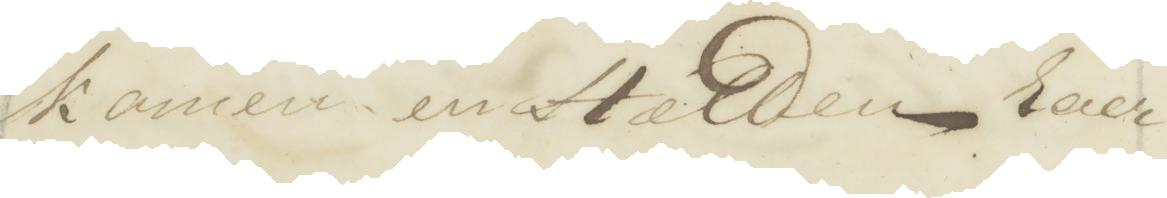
komen en stelden haer
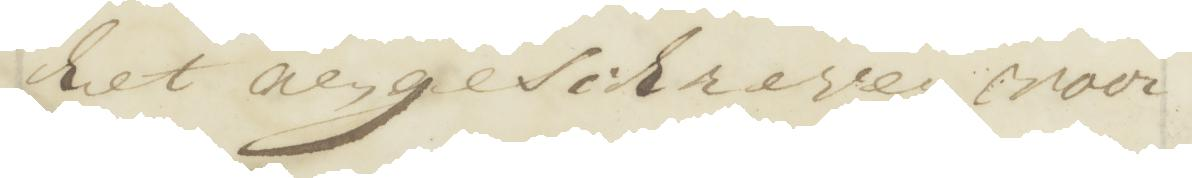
het aengeschreven voor
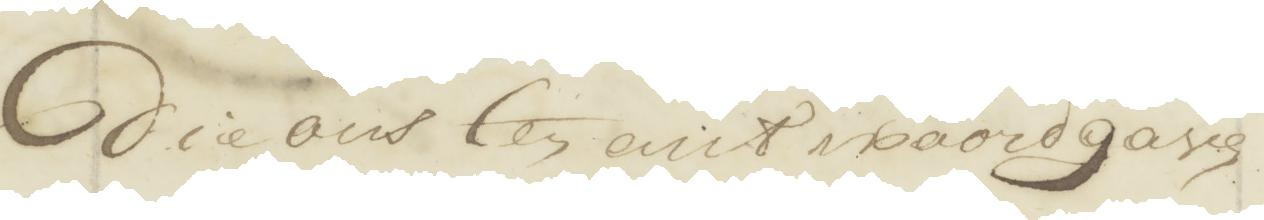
die ons ten antwoord gaven
